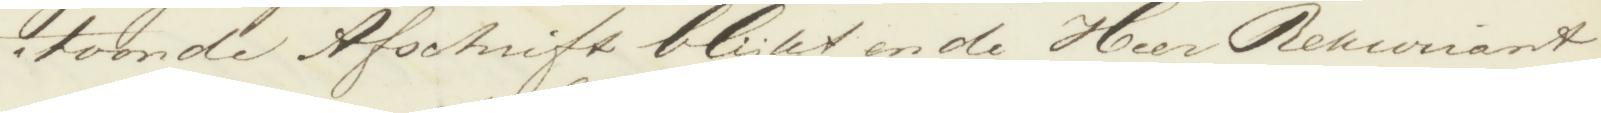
„toonde Afschrift blijkt en de Heer Rekwirant
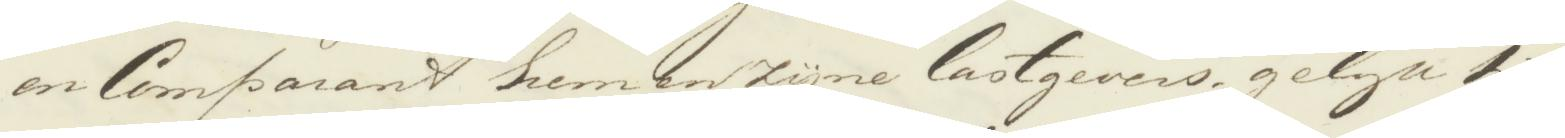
en Comparant hem en zijne lastgevers, gelyk hij
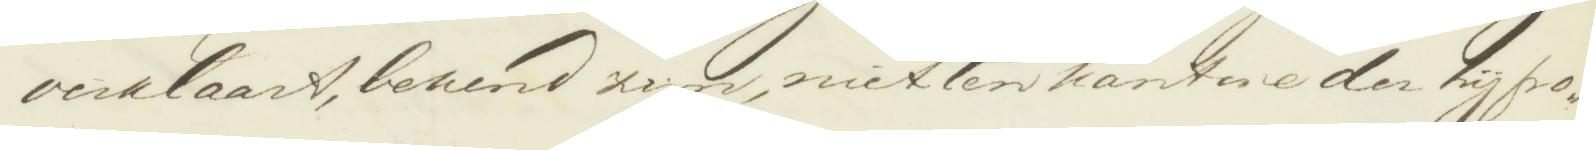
verklaart, bekend zijn, niet ten kantore der hijpo„
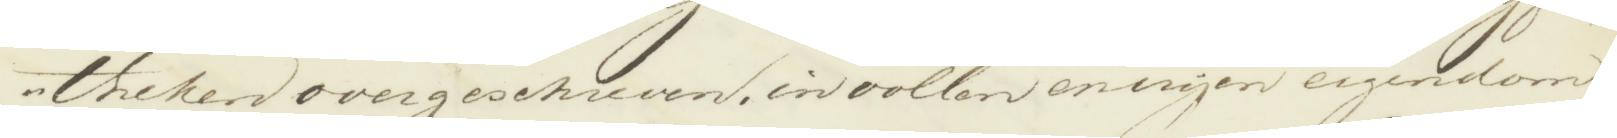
„theken overgeschreven, in vollen en vrijen eigendom
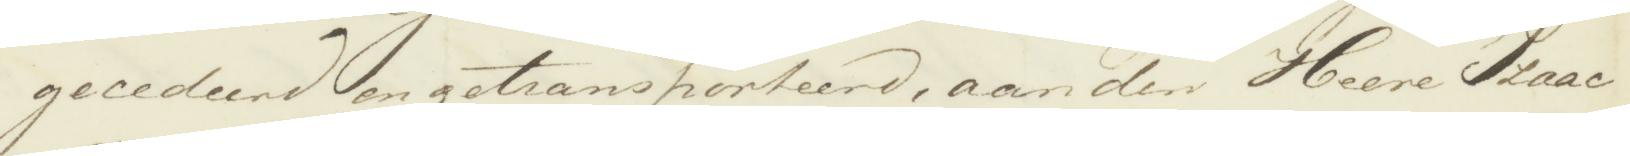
gecedeerd en getransporteerd, aan den Heere Izaac
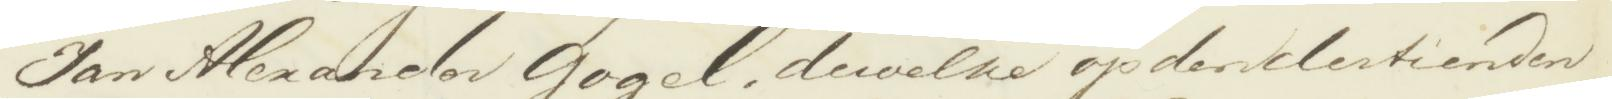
Ian Alexander Gogel, dewelke op den dertienden
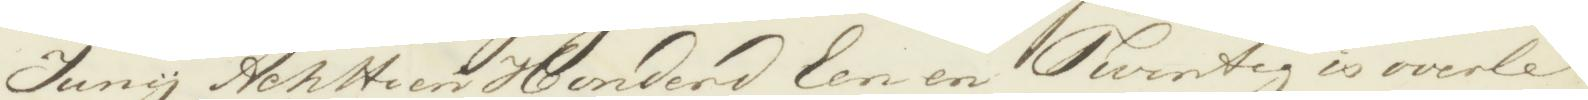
Iunij Achttien Honderd Een en Twintig is overle
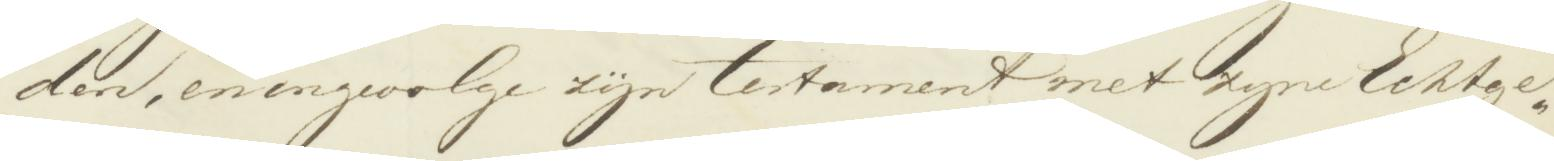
den, en ingevolge zijn testament met zyne Echtge„
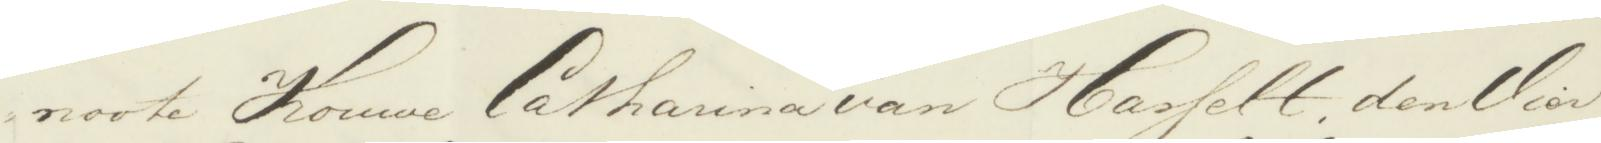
„noote Vrouwe Catharina van Hasselt, den Vier
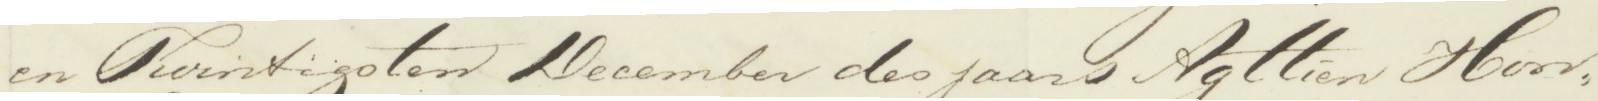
en Twintigsten December des jaars Agttien Hon„
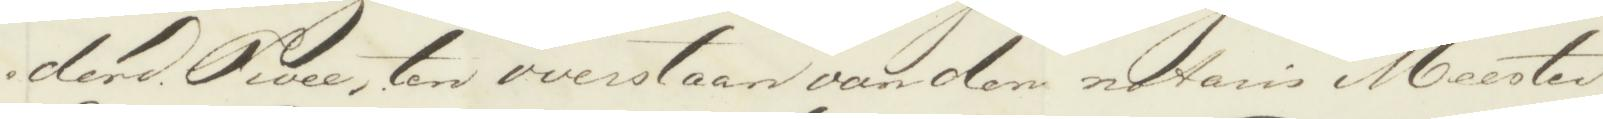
„derd Twee, ten overstaan van den notaris Meester
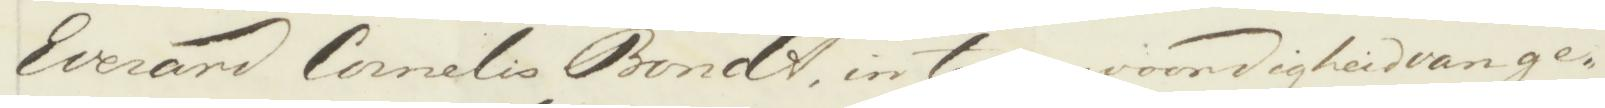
Everard Cornelis Bondt, in tegenwoordigheid van ge„
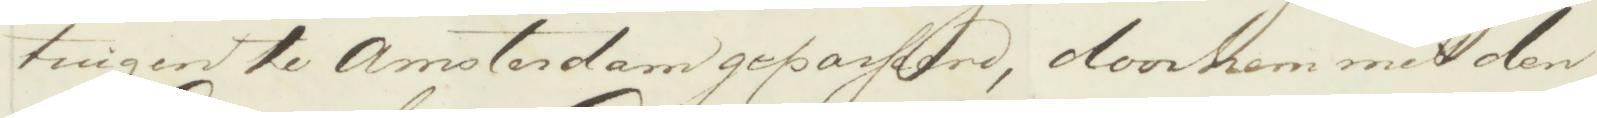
tuigen te Amsterdam gepasseerd, doorhem met den
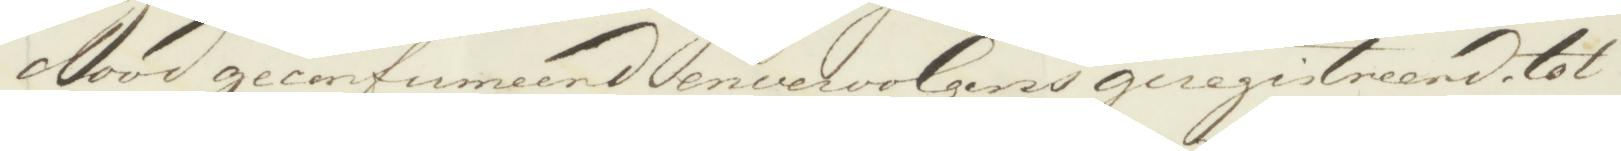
dood geconfirmeerd envervolgens geregistreerd, tot
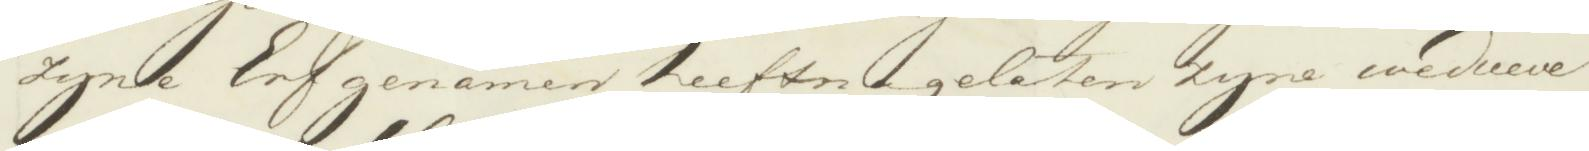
zyne Erfgenamen heeftna gelaten zyne weduwe
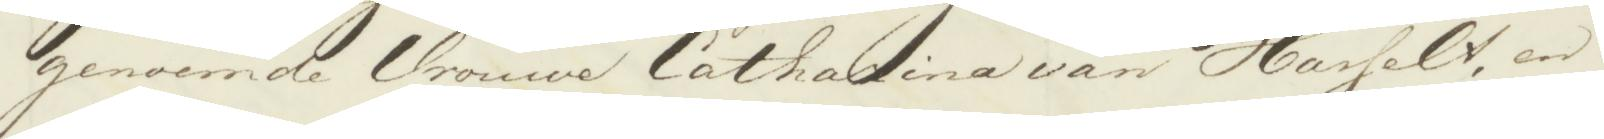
genoemde Vrouwe Catharina van Hasselt, en
